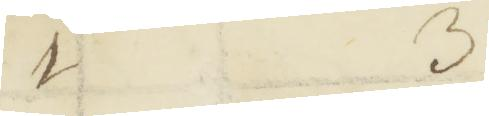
1 3
